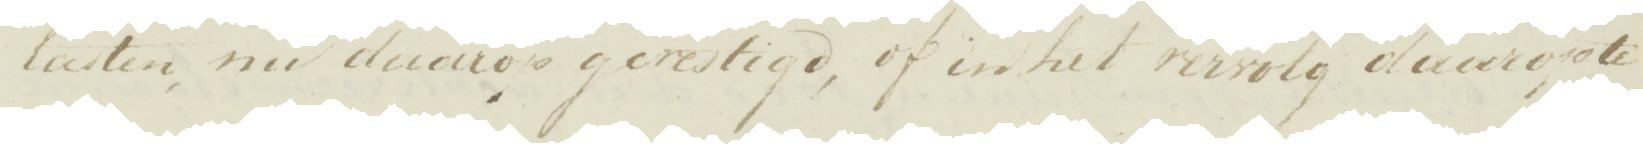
lasten, nu daarop gevestigd, of in het vervolg daarop te
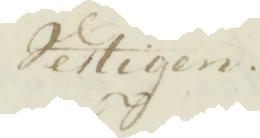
Vestigen
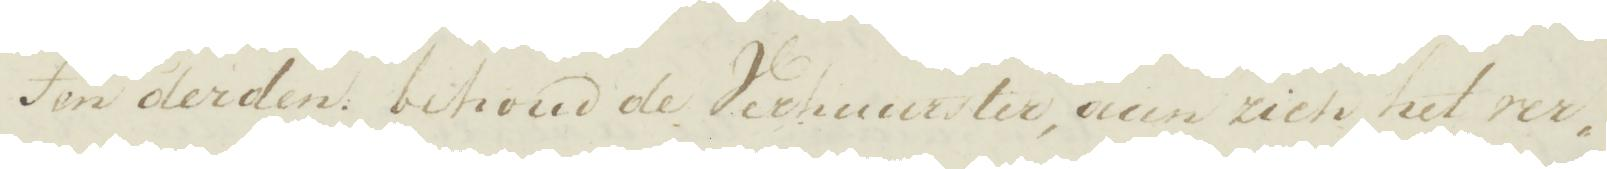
Ten derden: behoud de Verhuurster, aan zich het ver„
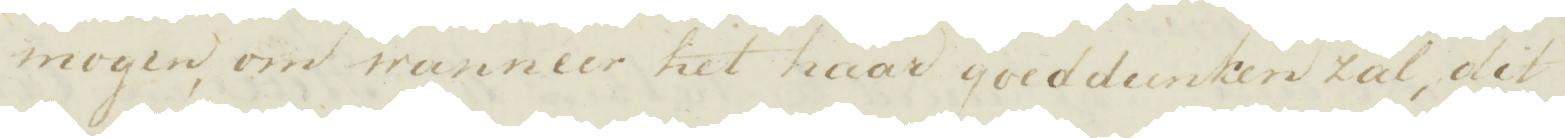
mogen, om wanneer het haar goeddunken zal, dit
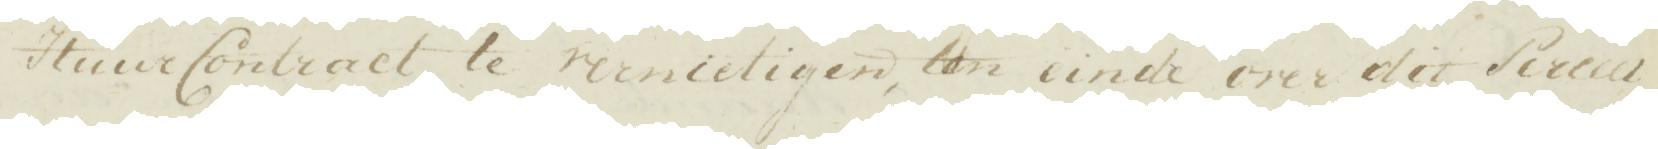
Huur Contract, te vernietigen, ten einde over dit Perceel
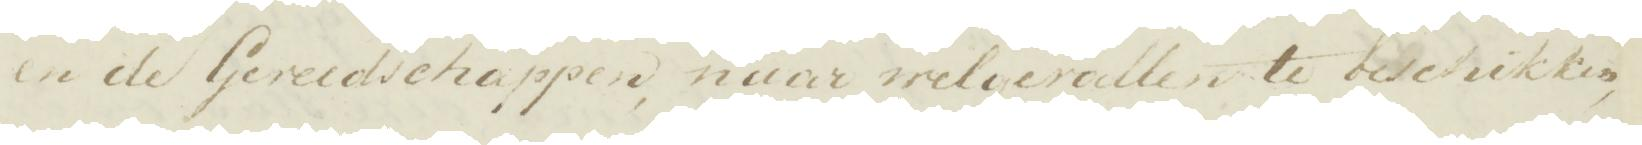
en de Gereedschappen, naar welgevallen te beschikken,
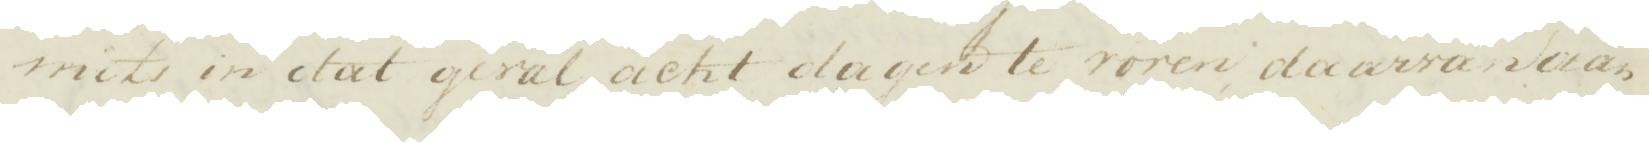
mits in dat geval, acht dagen te voren daarvan aan
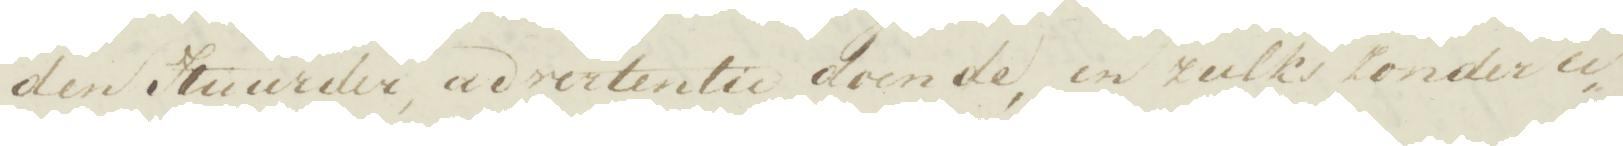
den Huurder, advertentie doende, en zulks zonder ee„
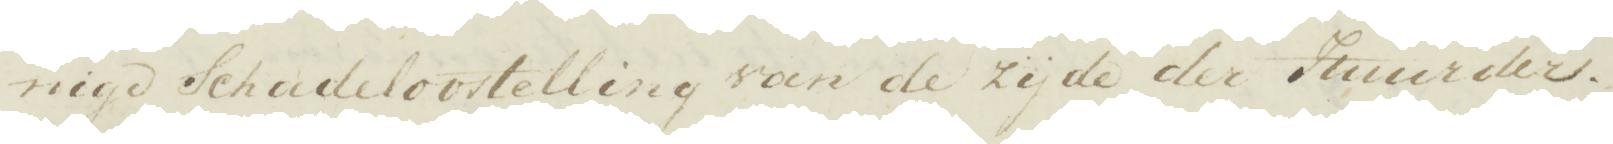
nige schadeloostelling van de zijde der Huurder.
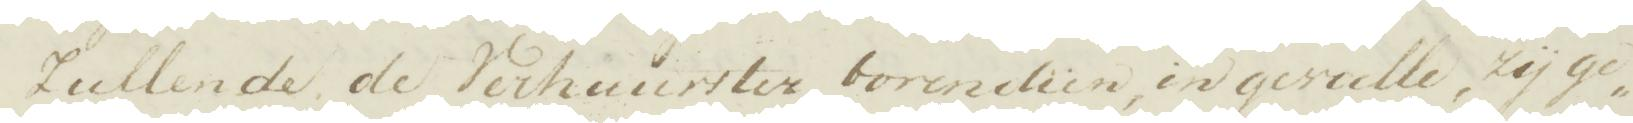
Zullende de Verhuurster bovendien, in gevalle, zij ge„
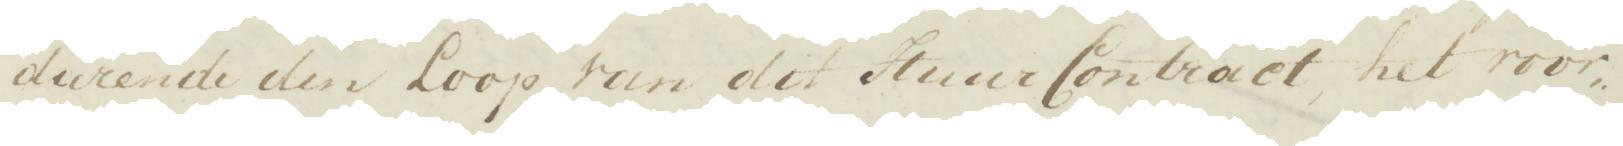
durende den Loop van dit Huur Contract, het voor„
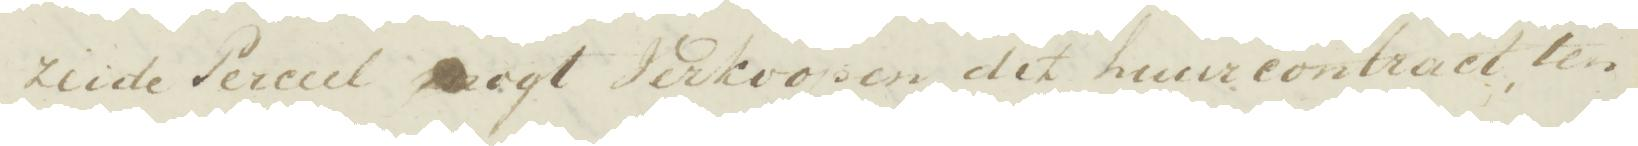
zeide Perceel mogt Verkoopen, dit huur contract, ten
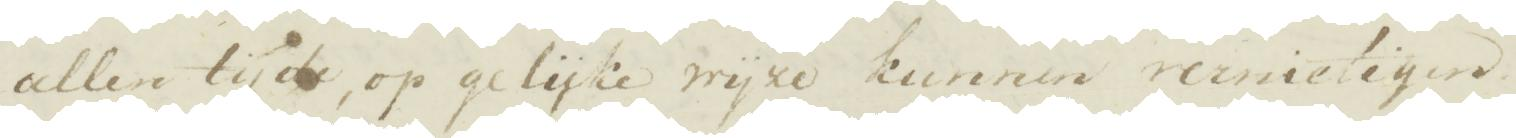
allen tijde, op gelijke wijze kunnen vernietigen.
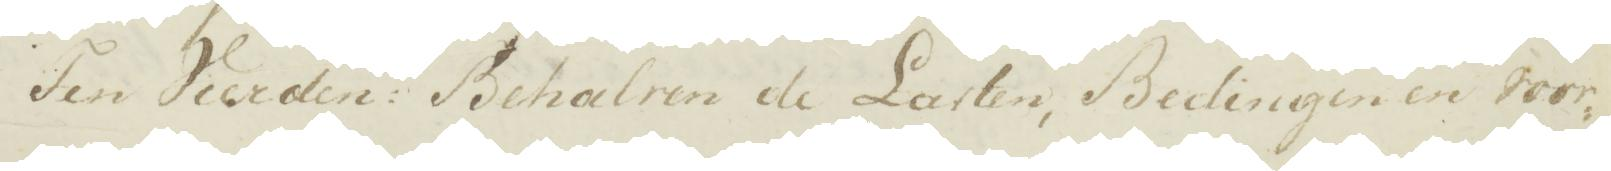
Ten Vierden: Behalven de Lasten, Bedingen en voor„
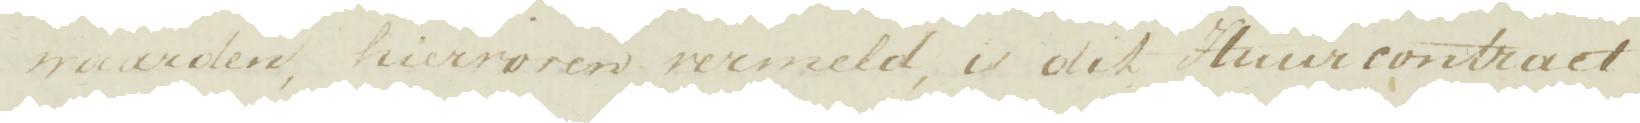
waarden, hiervoren vermeld, is dit Huur contract
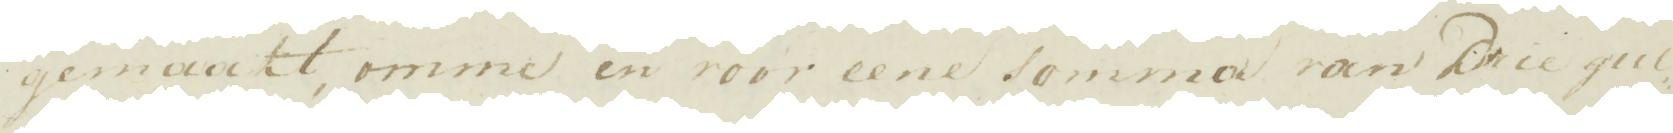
gemaakt, omme en voor eene somma van Drie gul„
